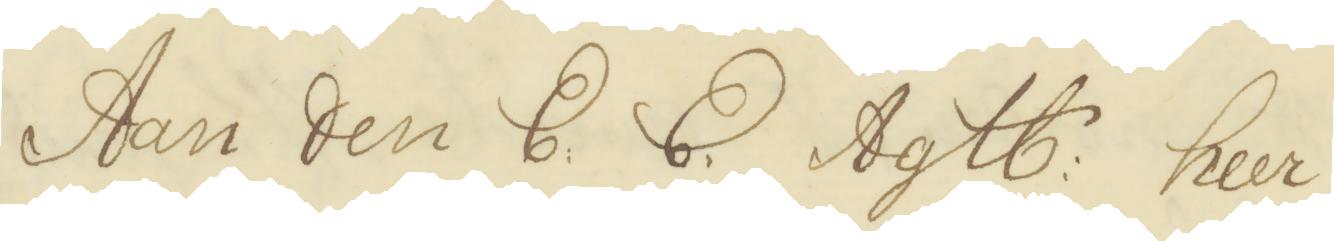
Aan den E: E: Agtb: heer
